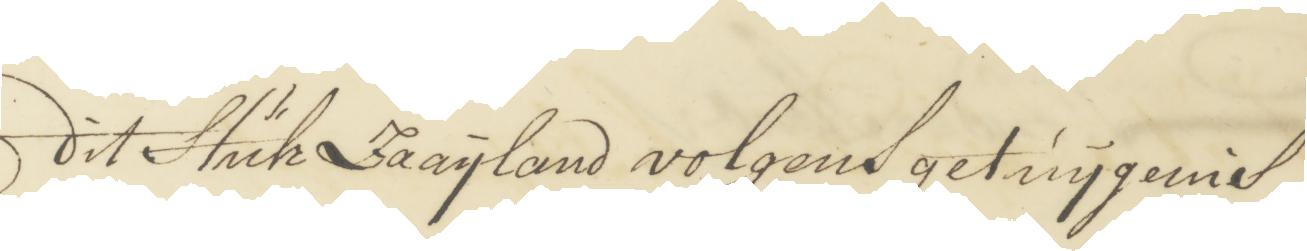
dit stuk zaaijland volgens getuijgenis
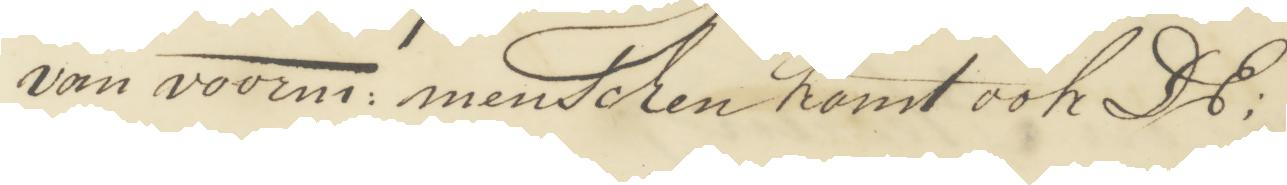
van voorm: menschen komt ook DE:
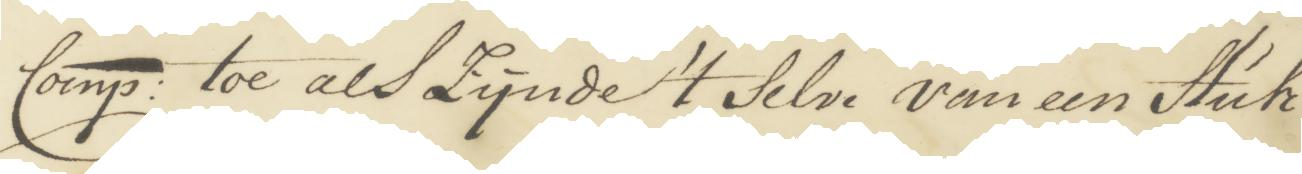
Comp: toe als zijnde ’t selve van een stuk
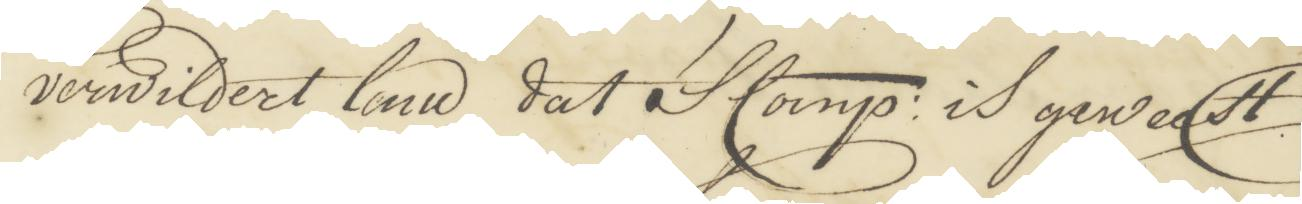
verwildert land dat 's Comp: is geweest
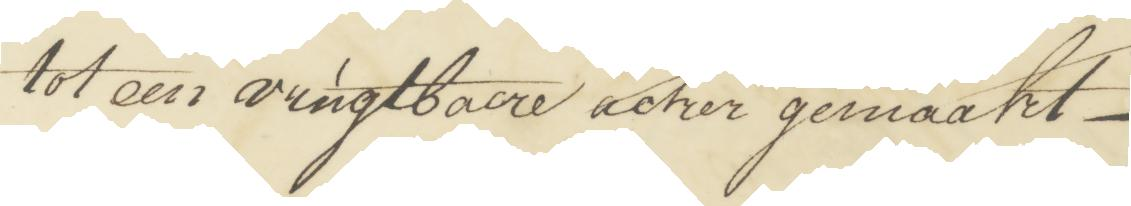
tot een vrugtbaere acker gemaakt —
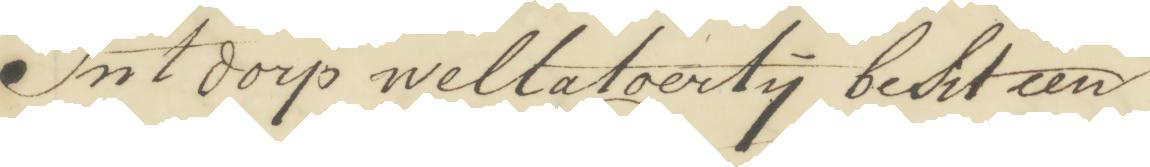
In 't dorp weltatoertij besit een
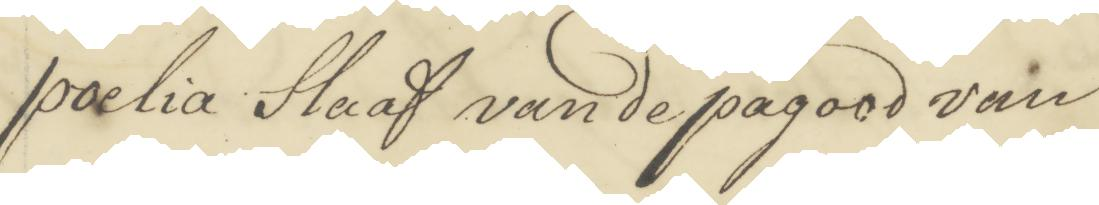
poelia slaaf van de pagood van
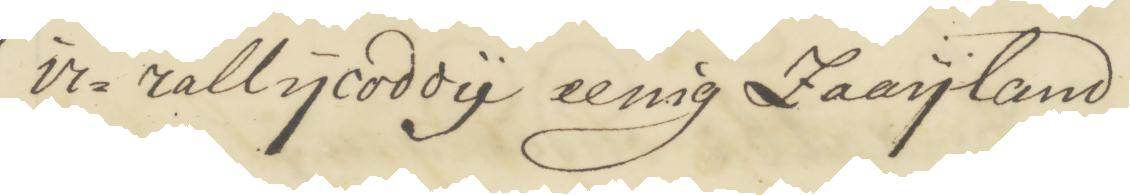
ir= rallijcoddij eenig zaaijland
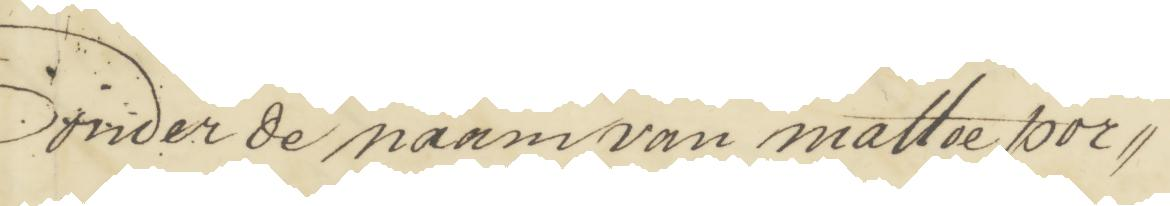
onder de naam van mattoe por„
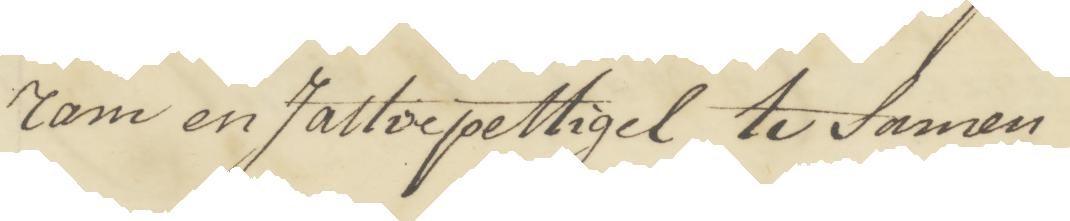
ram en Jattoepettigel te samen
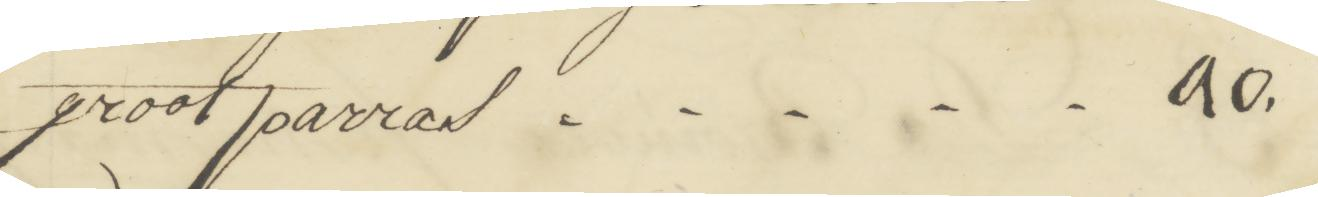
groot parras - - - - - 40.
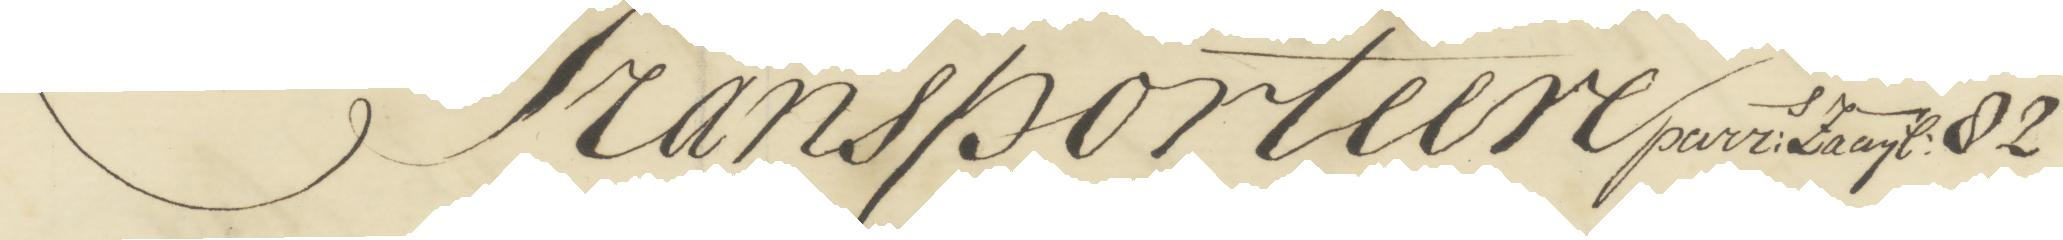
Transporteere parr:s zaayl: 82
